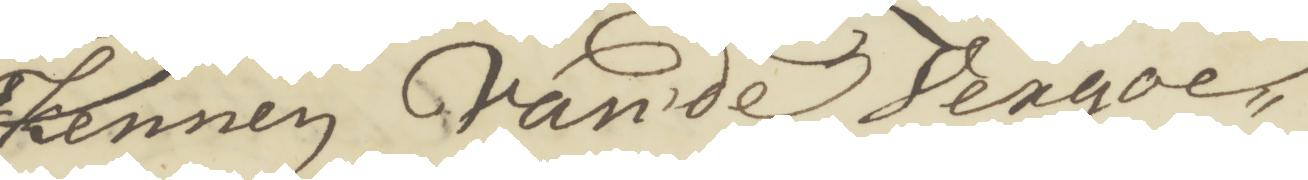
kennen van de Vergoe„
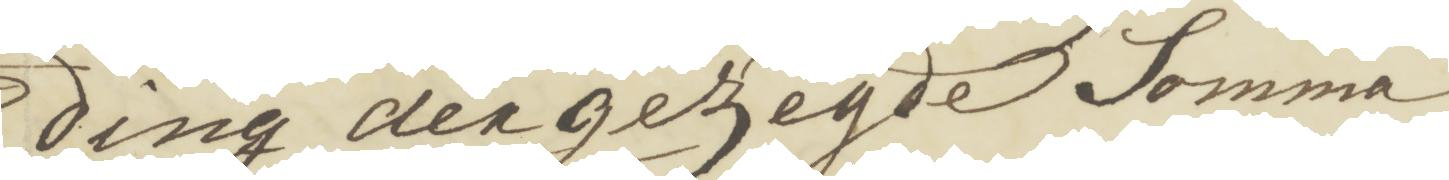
ding der gezegde somma
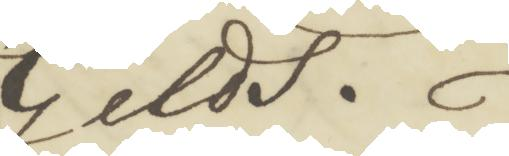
Gelds.
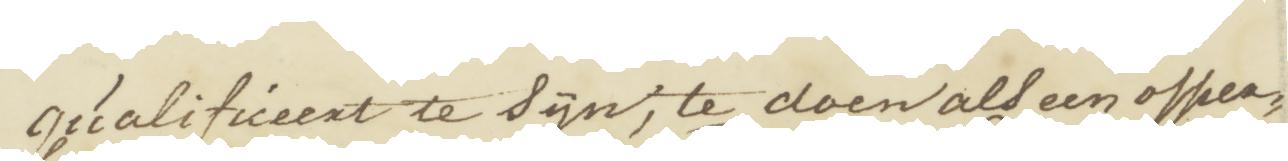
qualificeert te sijn, te doen als een opper„
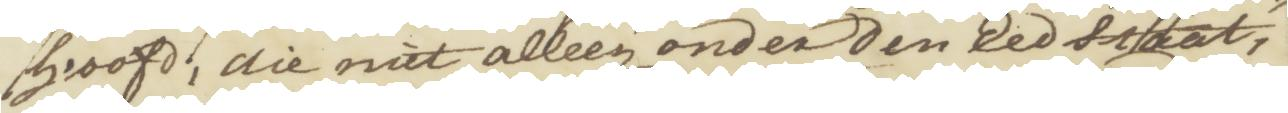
hoofd, die niet alleen onder den Eed staat,
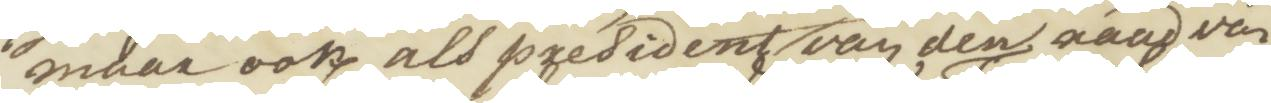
maar ook als president van den raad van,
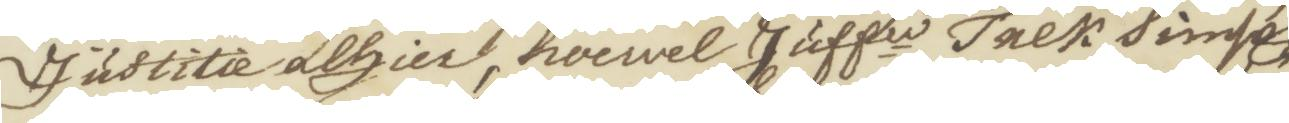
Justitie alhier, hoewel Juff=w Trek simpe
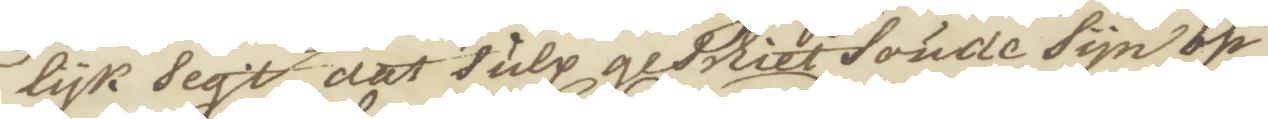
lijk segt, dat sulx geschiet soude sijn op
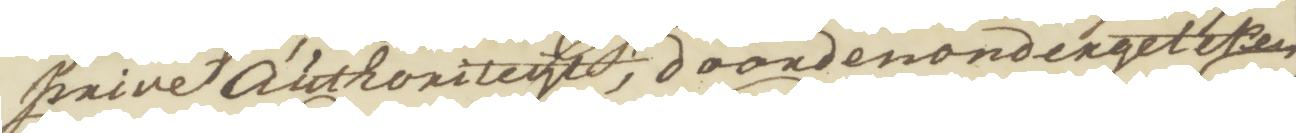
prive Authoriteijt, door den ondergeteken,
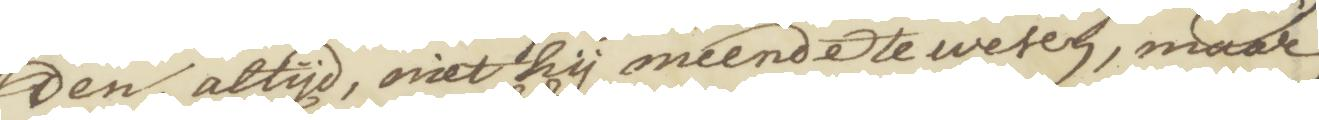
den altijd, niet hij meende te wesen, maar
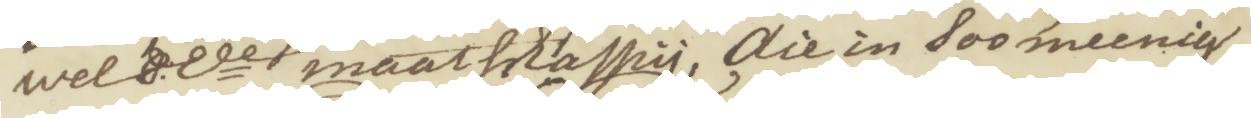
wel dE=le maatschappij, die in soo meenig
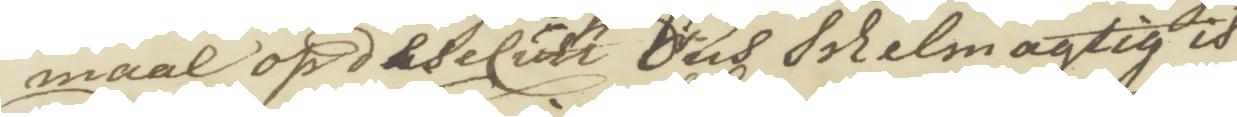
maal op dese cust dus schelmagtig is
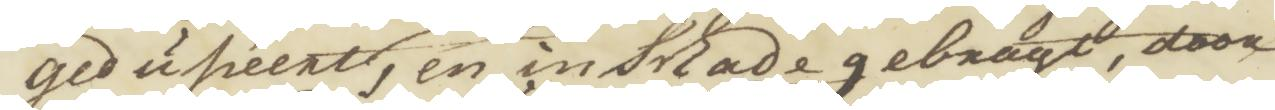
gedupeert, en in schade gebragt, door
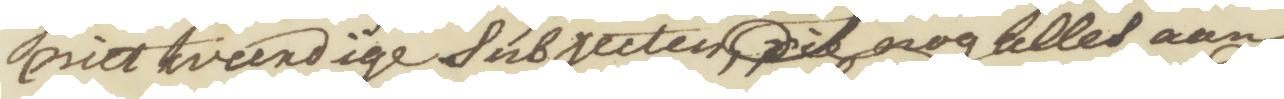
niet weerdige subjecten die nog alles aan
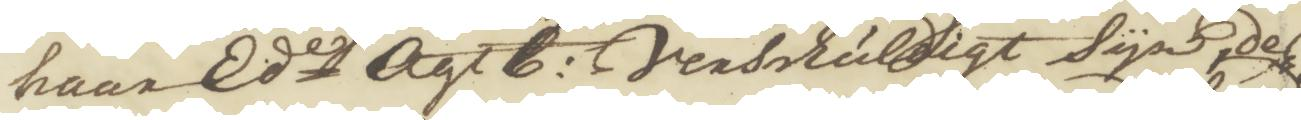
haar Ed=e Agtb: verschuldigt sijn de
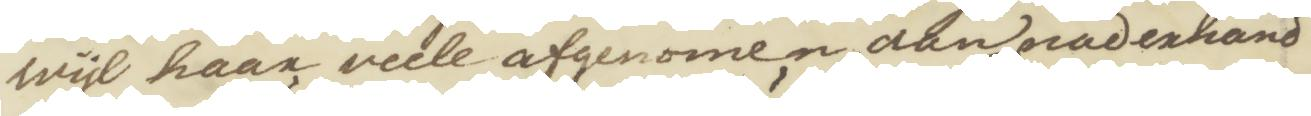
wijl haar veele afgenomen, dan naderhand
